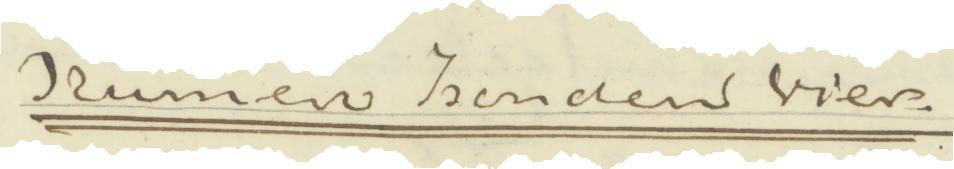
Numero honderd vier.
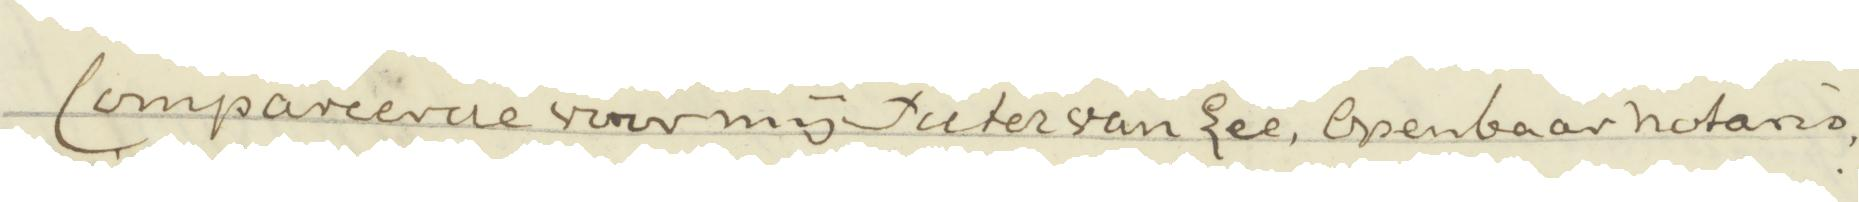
Compareerde voor mij Pieter van Lee Openbaar notaris
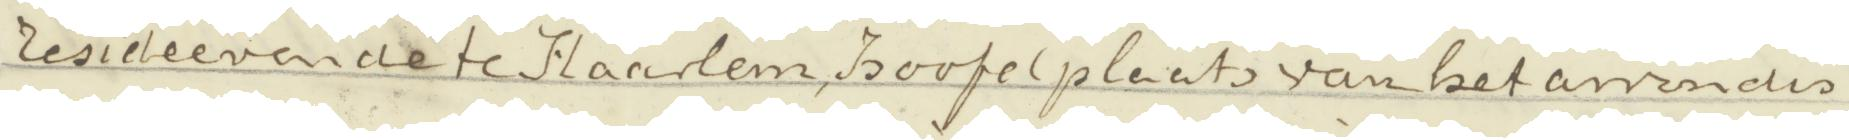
resideerende te Haarlem, hoofdplaats van het arrondis
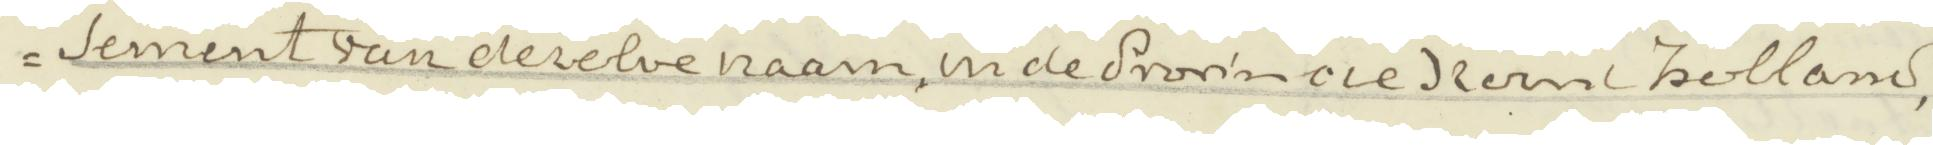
=sement van dezelve naam, in de Provincie Noort holland,
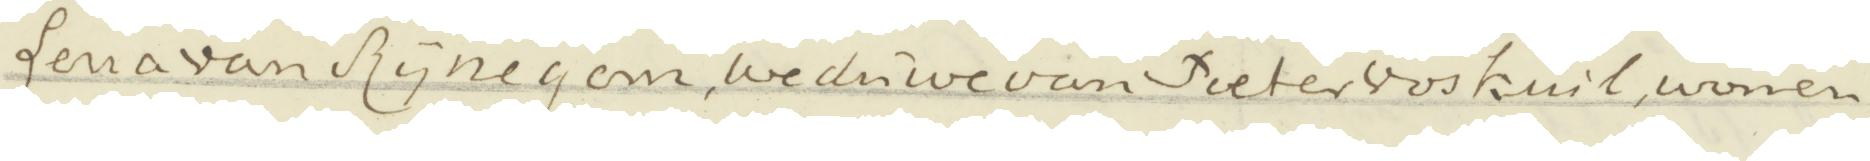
Lena van Rijnegom, weduwe van Pieter Voskuil, wonen
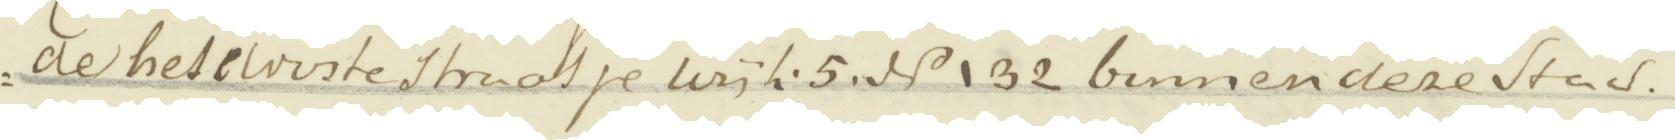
de het drostestraatje wijk 5. N 132 binnen deze stad.
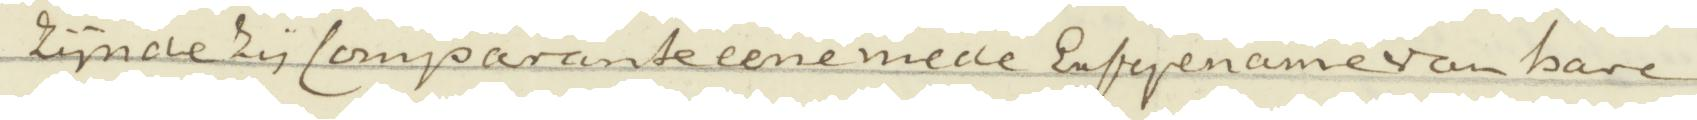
Zijnde Zij Comparante eene mede Erfgename van hare
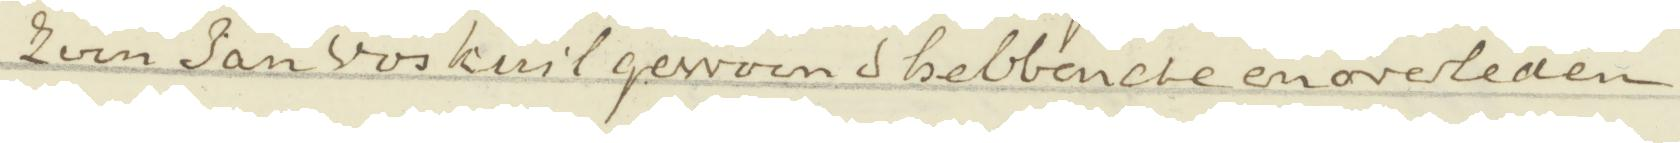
zoon Jan Voskuil gewoond hebbende en overleden
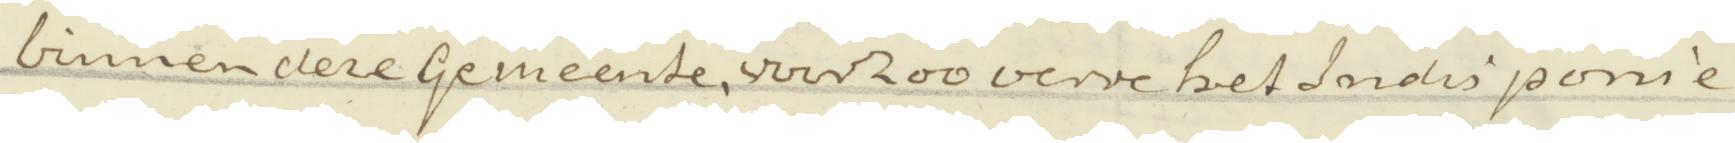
binnen deze Gemeente voor zoo verre het In disponie
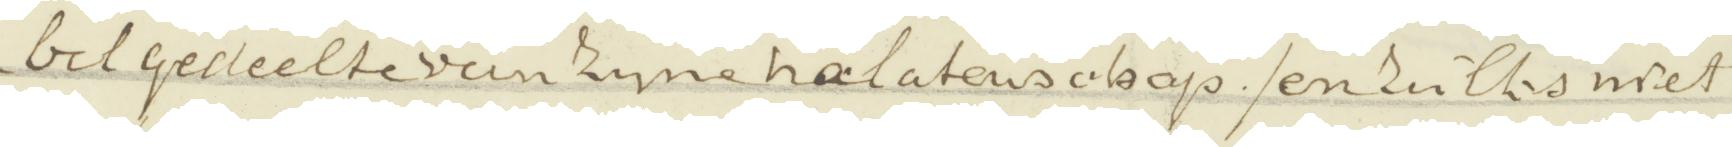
=bel gedeelte van Zyne nalatenschap /en zulks niet
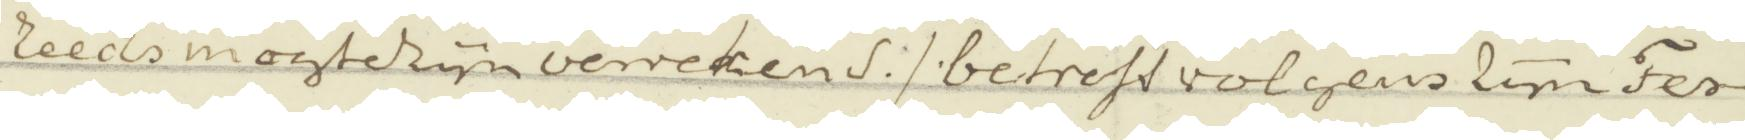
reeds mogte zijn verrekend :/ betreft volgens Zijn Tes-
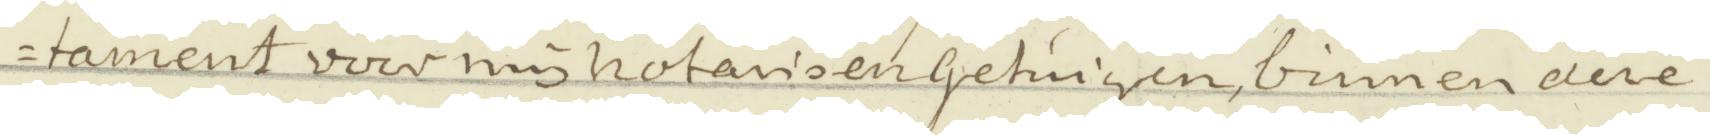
=tament voor mij Notaris en getuigen, binnen deze
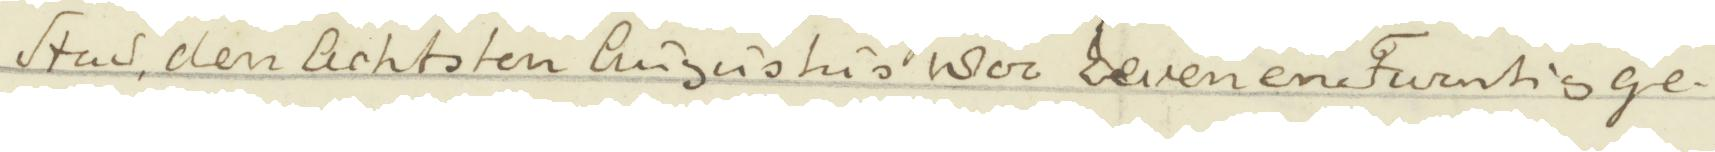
Stad den Achtsten Augustus 1800 Zeven en Twintig ge=
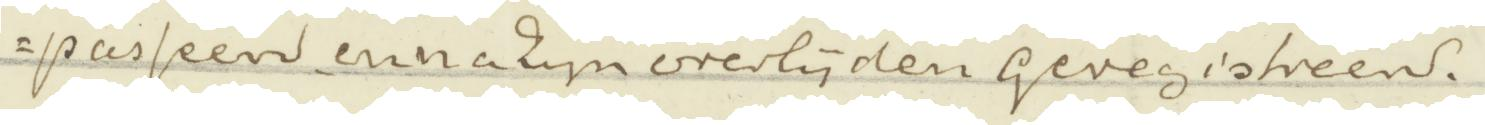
=passeerd en na Zyn overlijden Geregistreerd.
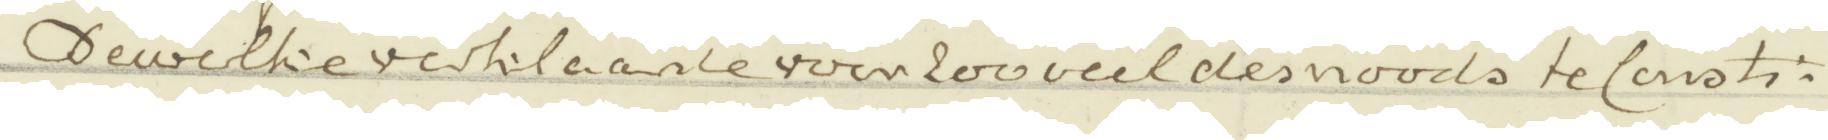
Dewelke verklaarde voor zoo veel desnoods te Consti-
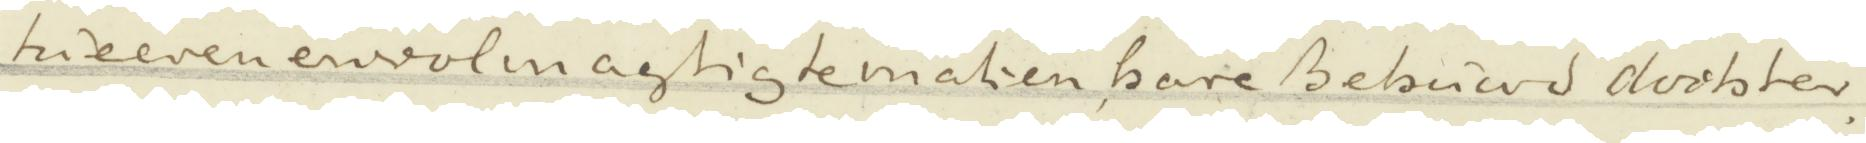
tueeren en volmagtig te maken hare Behuwd dochter,
